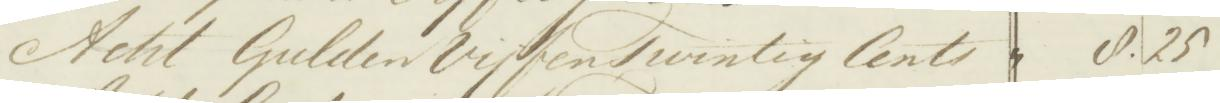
Acht Gulden Vijfen Twintig Cents „ 8.25
